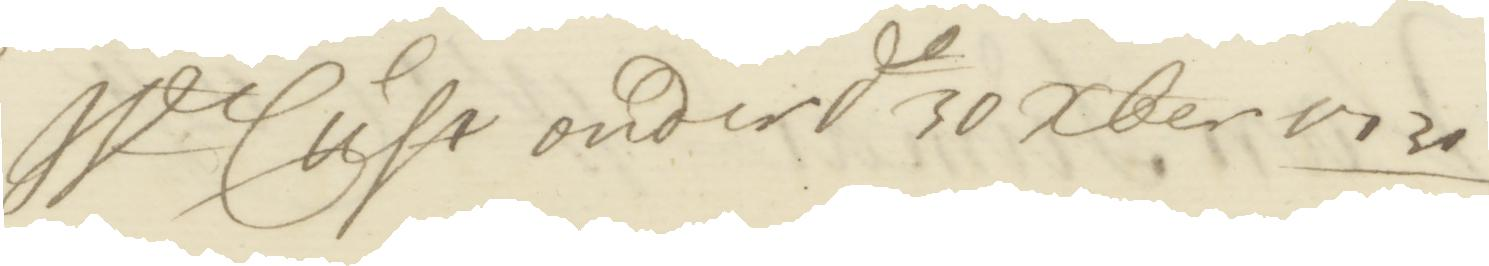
W-t Cust onderd=o 30xber 1731
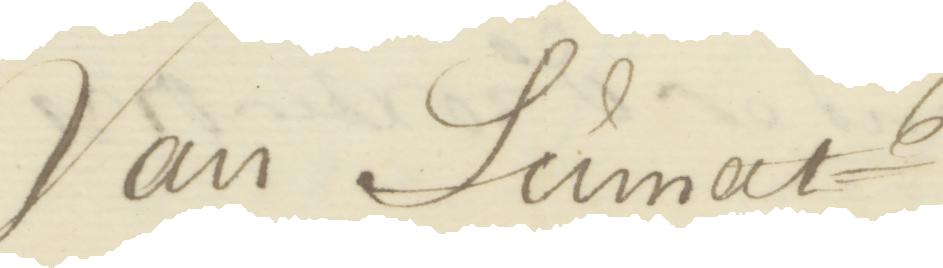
Van Summat=s
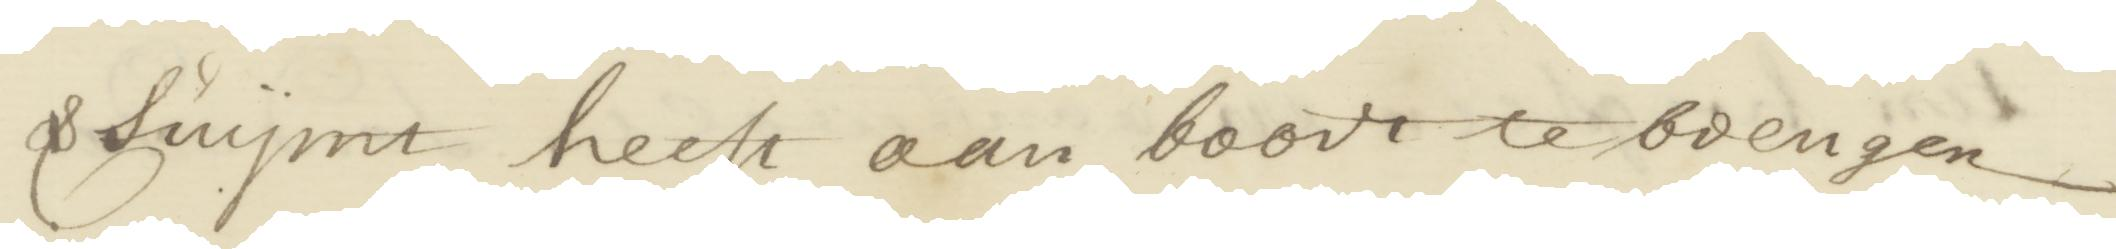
versuijmt heeft aan boort te brengen
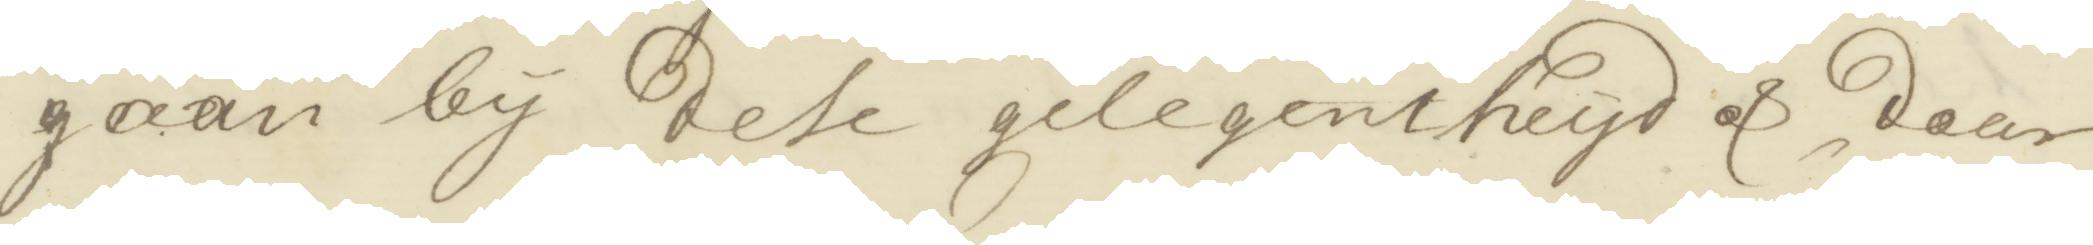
gaan bij dese gelegentheijd over, daar
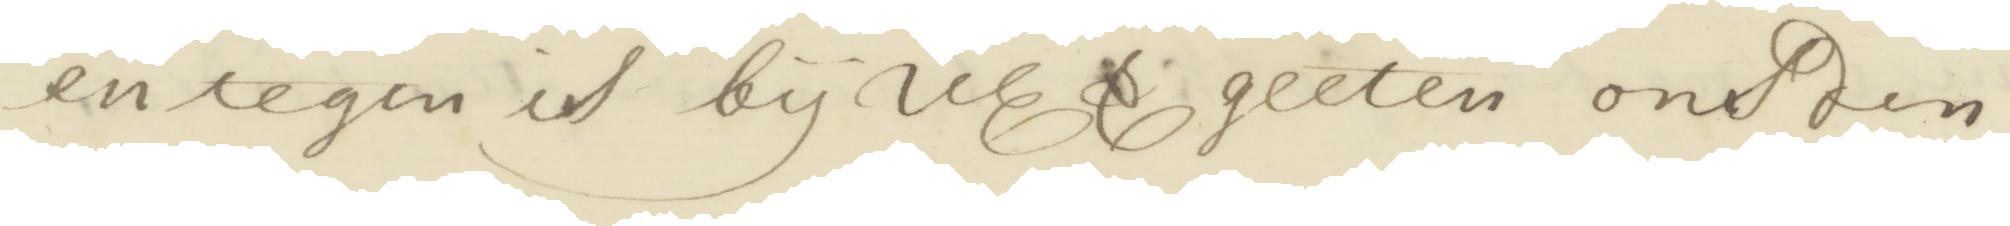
en tegen is bij UE vergeeten ons den
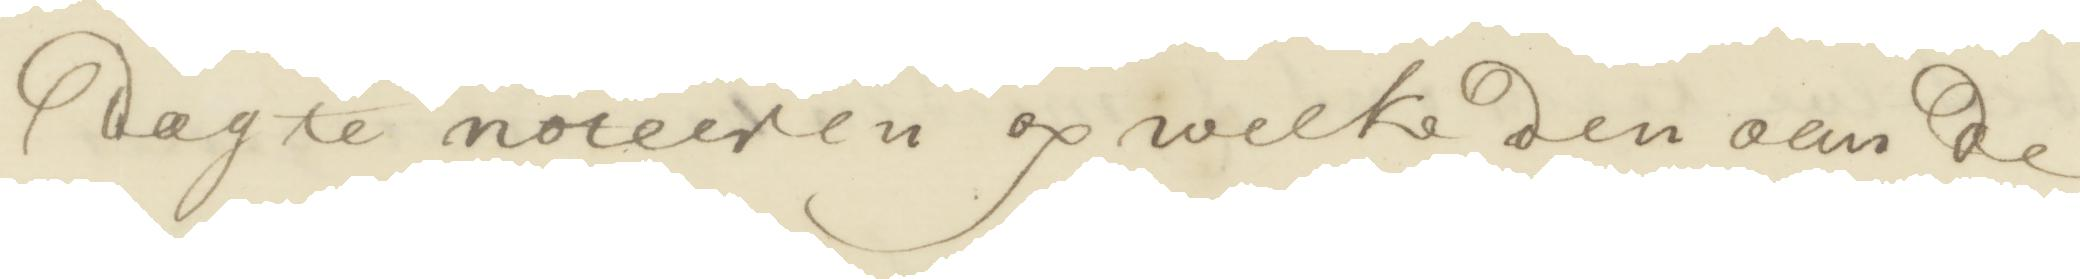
dag te noteeren op welke den aan de
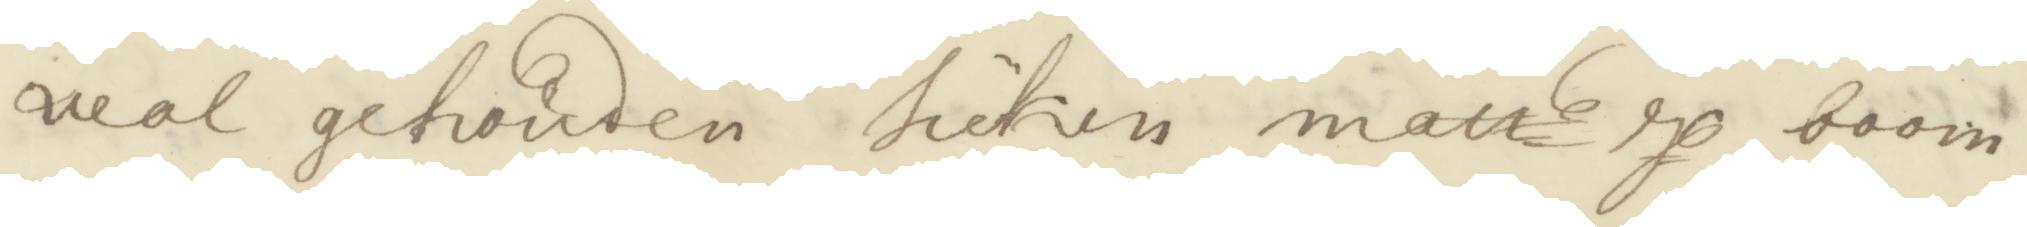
wal gehouden sieken matt:s j=e boom
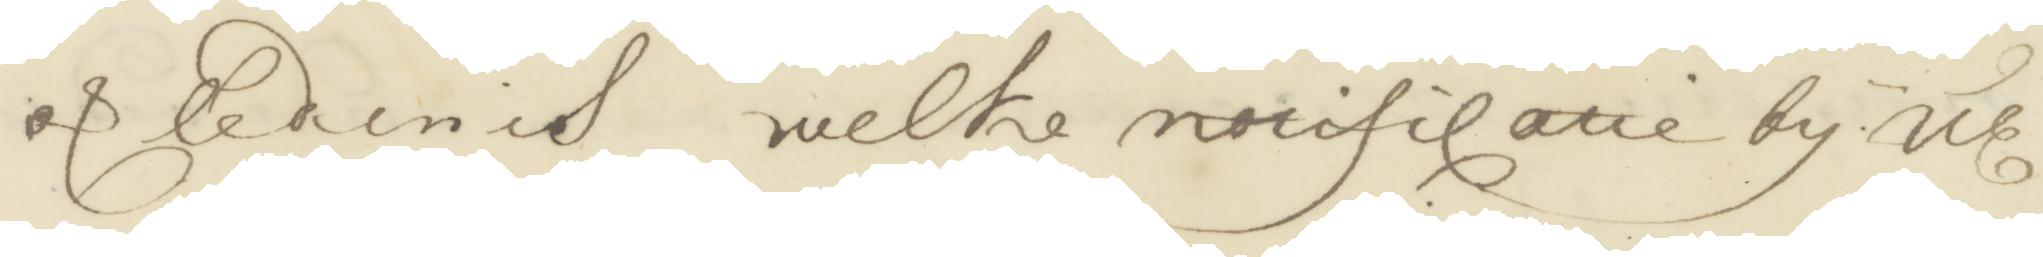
overleden is welke notificatie bij UE:
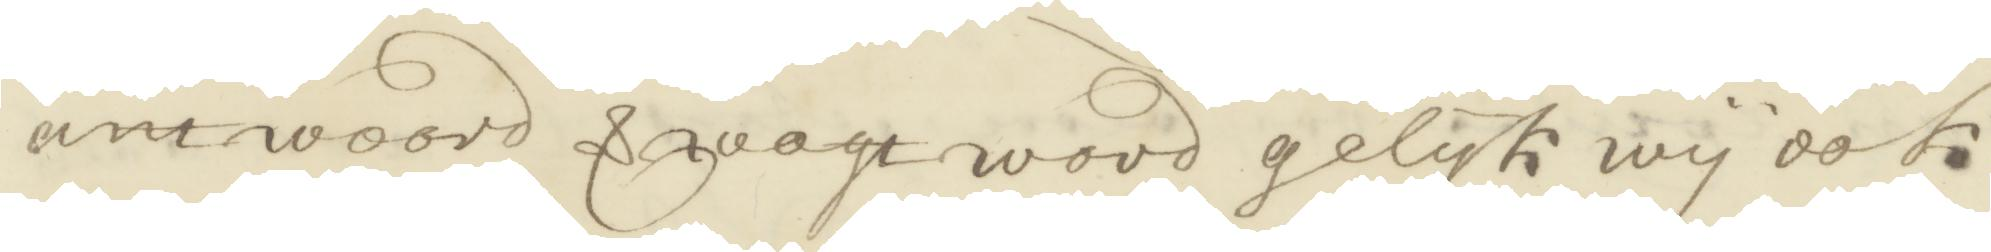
antwoord verwagt word gelijk wij ook
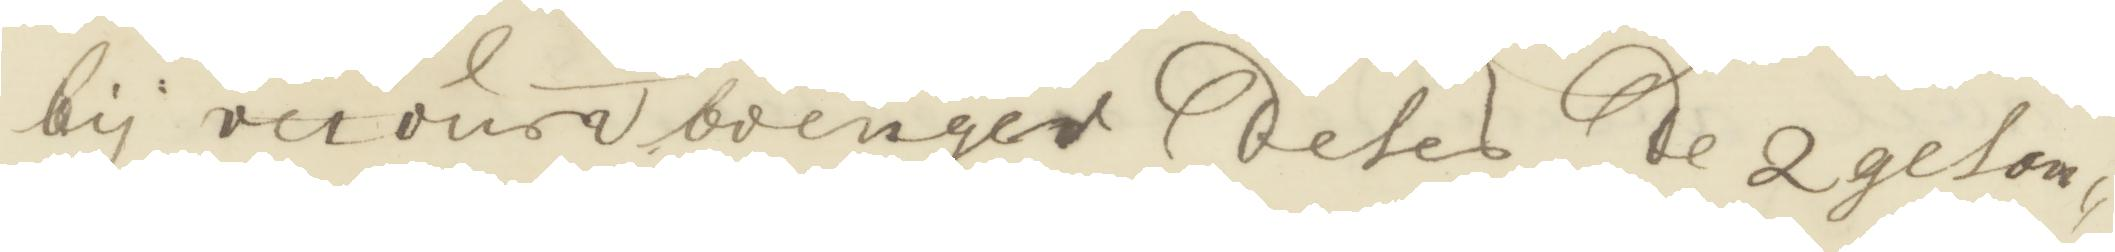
bij retourebrenger deses de 2 geson„
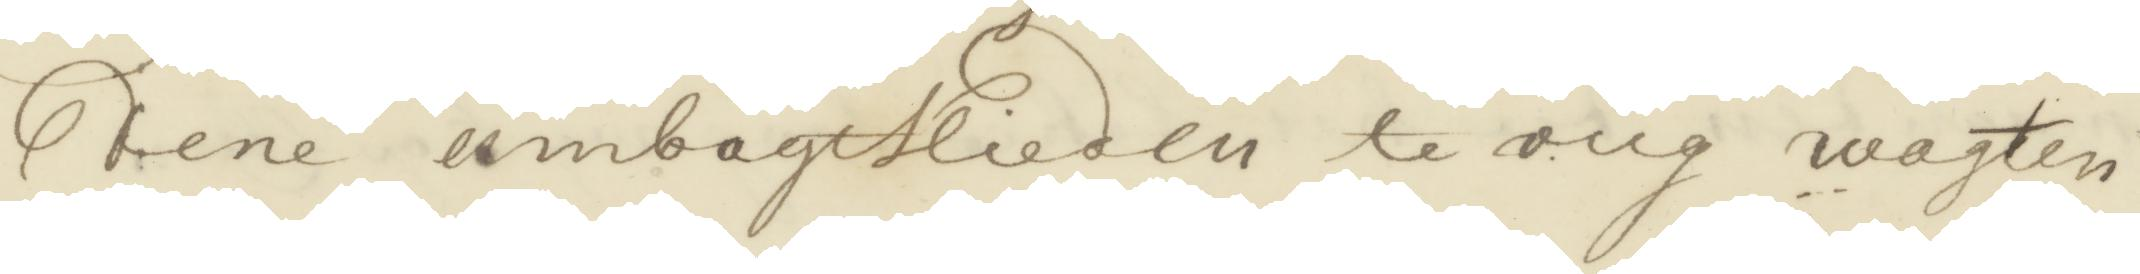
dene ambagtslieden te rug wagten
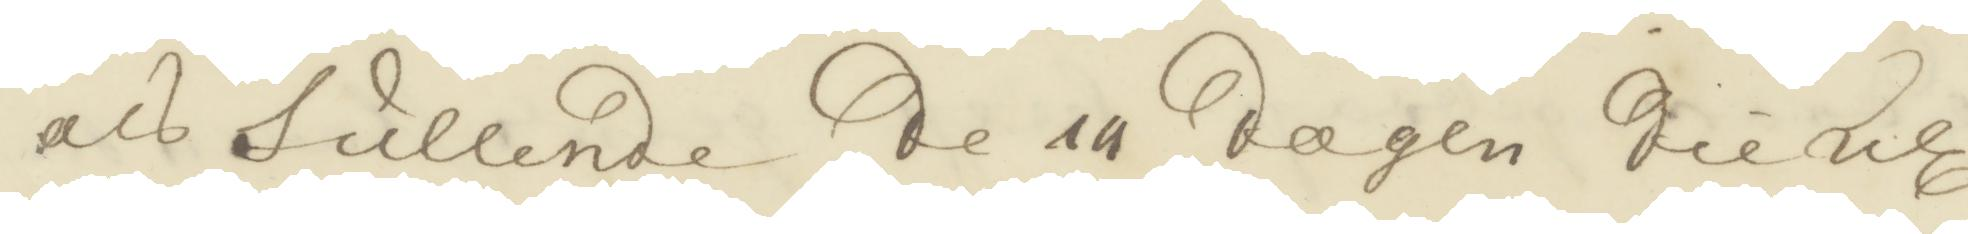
als sullende de 14 dagen die uE
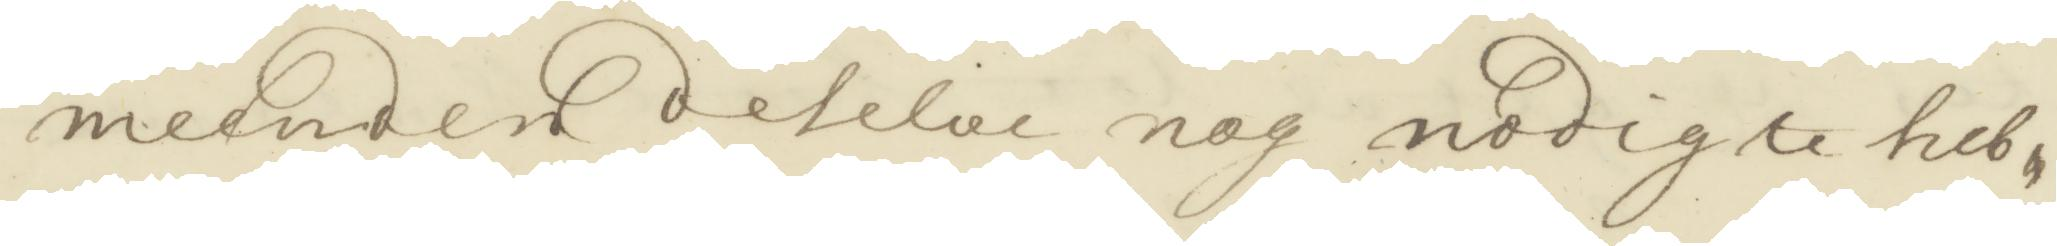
meenden deselve nog nodig te heb„
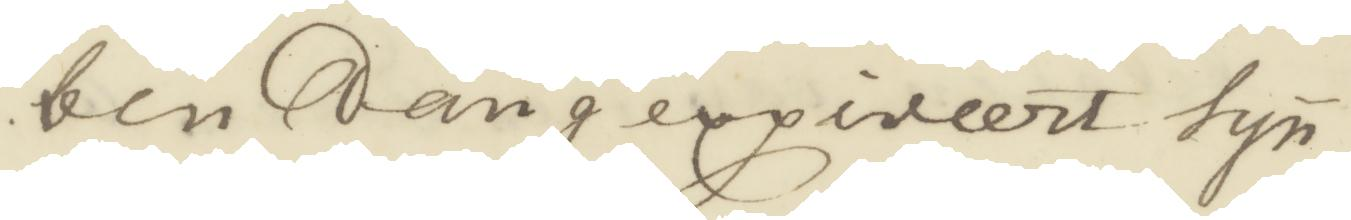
ben dan g’expireert sijn
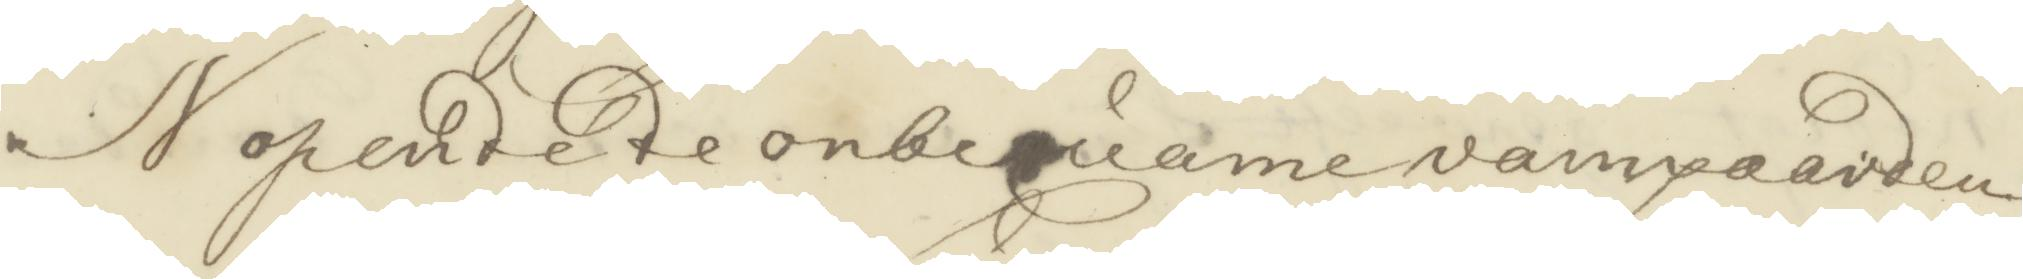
Nopende de onbequame rampaarden
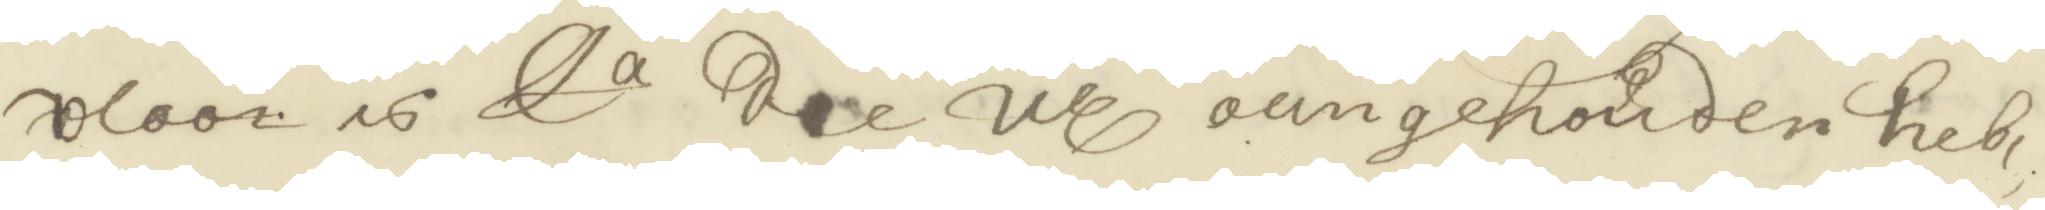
vloot is &a die UE aangehouden heb„
